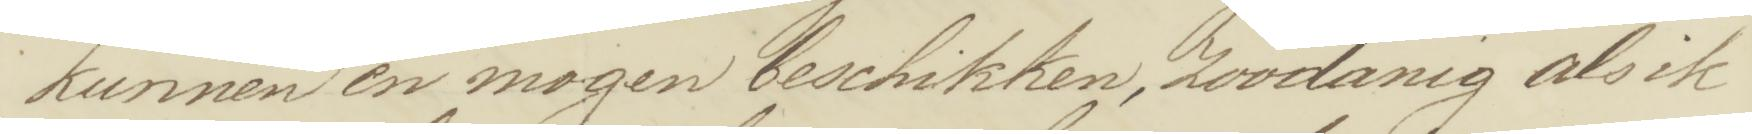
kunnen en mogen beschikken, zoodanig als ik
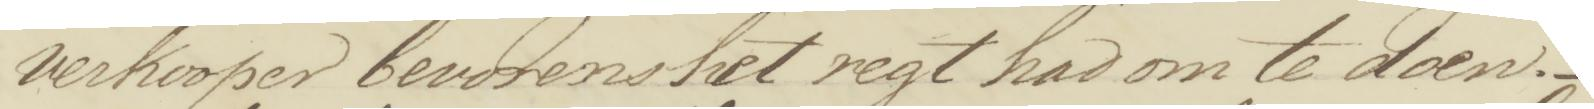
verkooper bevorens het regt had om te doen. —
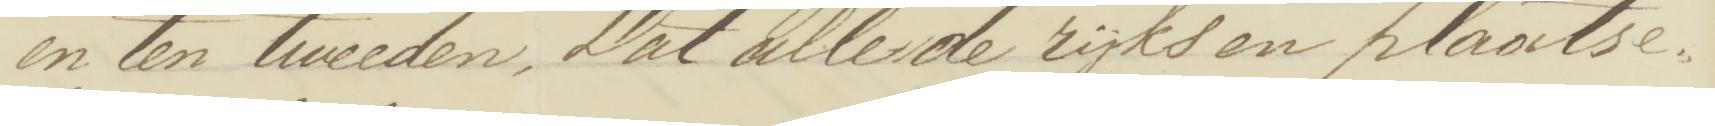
en ten tweeden, Dat alle de rijks en plaatse„
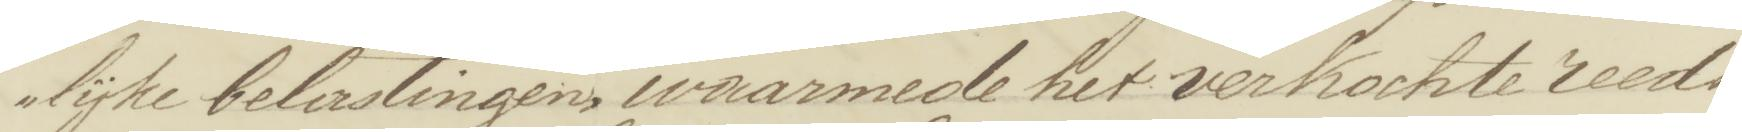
„lijke belastingen, waarmede het verkochte reeds
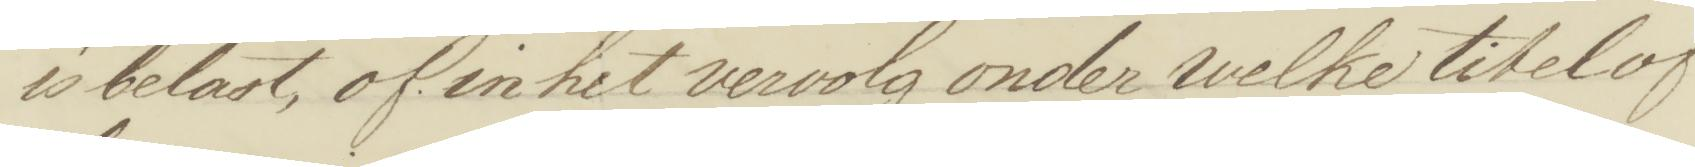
is belast, of in het vervolg onder welke titel of
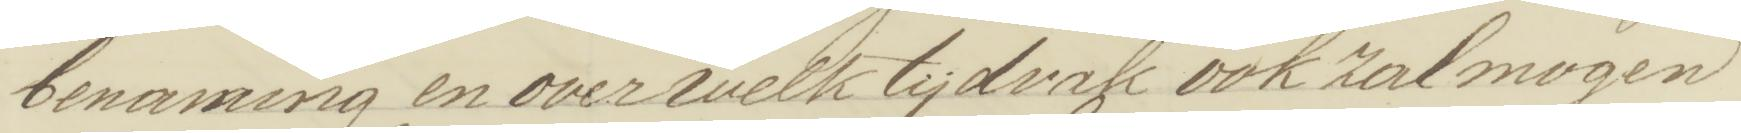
benaming en over welk tijdvak ook zal mogen
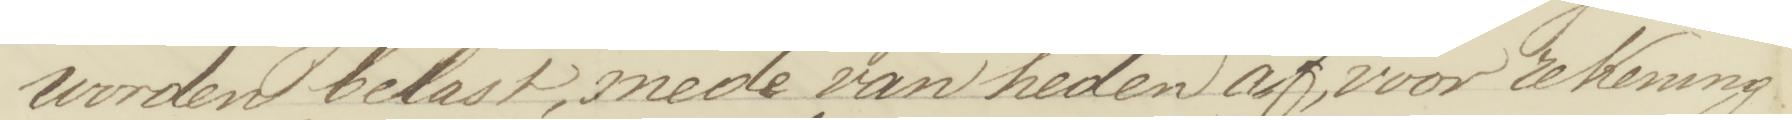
worden belast, mede van heden af, voor rekening
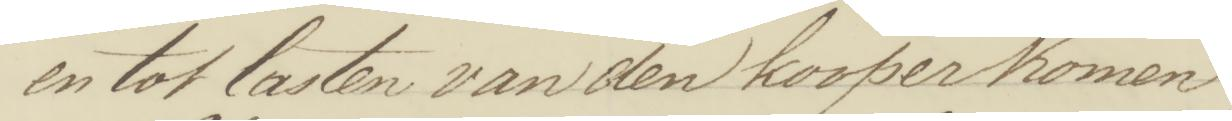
en tot lasten van den kooper komen
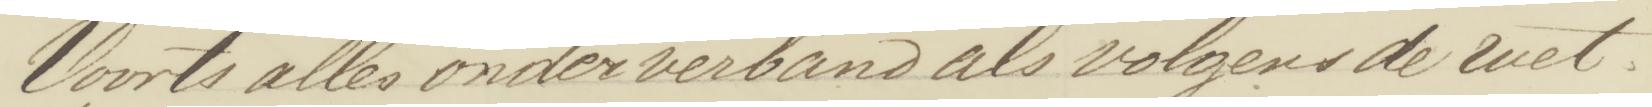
Voorts alles onder verband als volgens de wet.
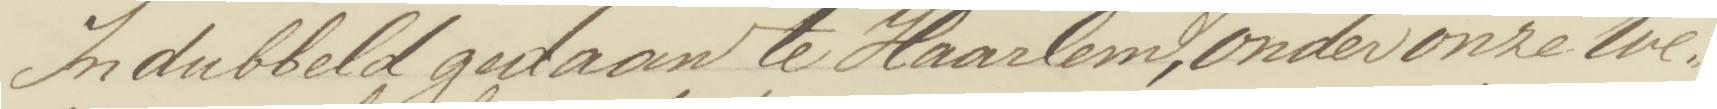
In dubbeld gedaan te Haarlem, onder onze We„
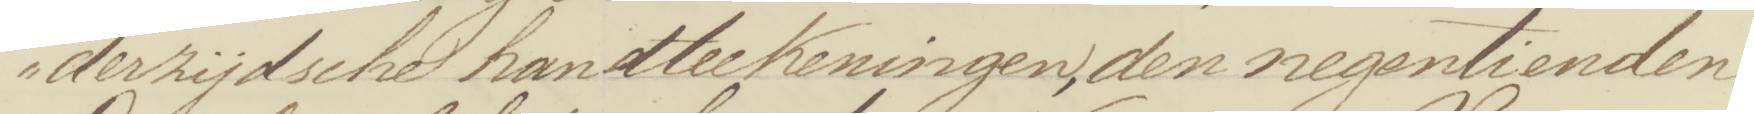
„derzijdsche handteekeningen, den negentienden
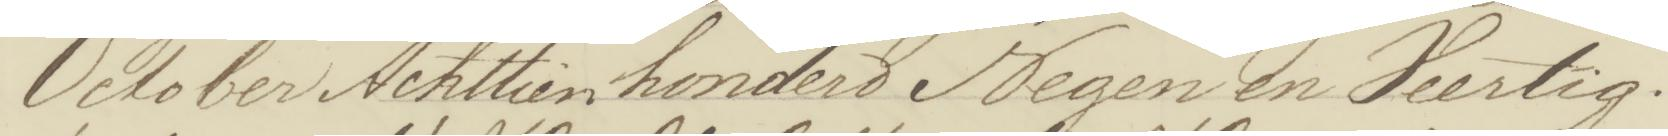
October Achttien honderd Negen en Veertig.
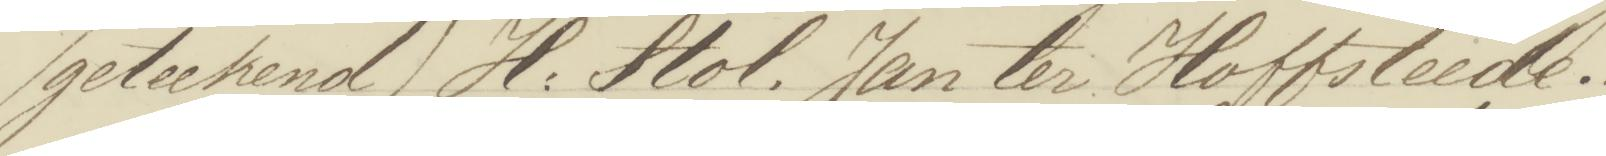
/geteekend) H: Stol, Jan ter Hoffsteede.
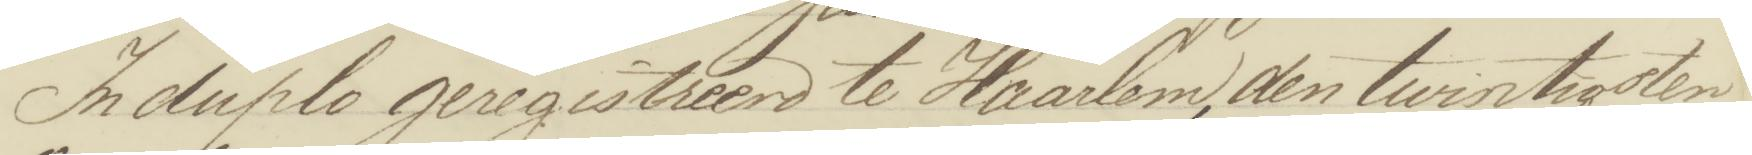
In duplo geregistreerd te Haarlem, den twintigsten
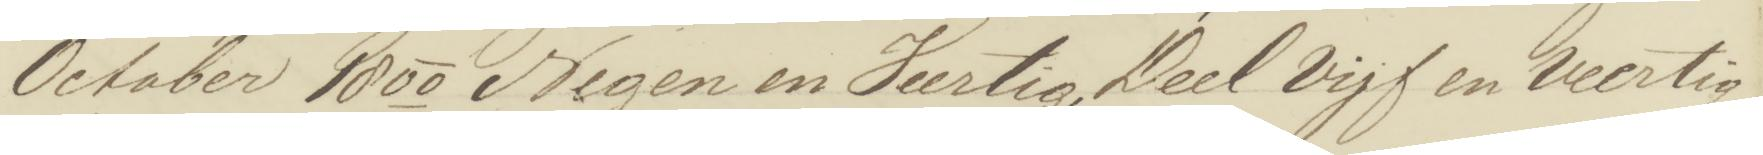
October 1800 Negen en Veertig, Deel vijf en veertig,
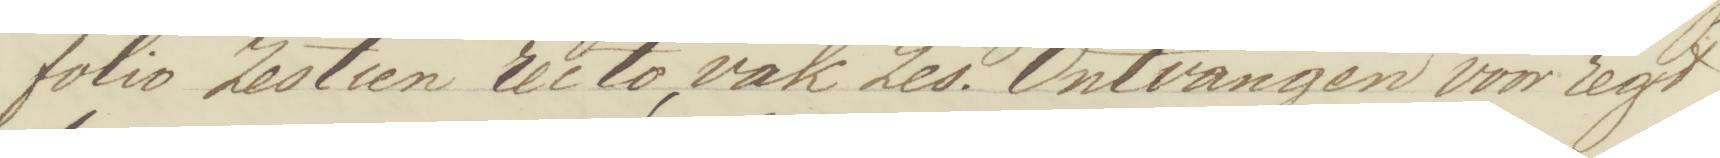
folio Zestien recto vak zes. Ontvangen voor Regt
